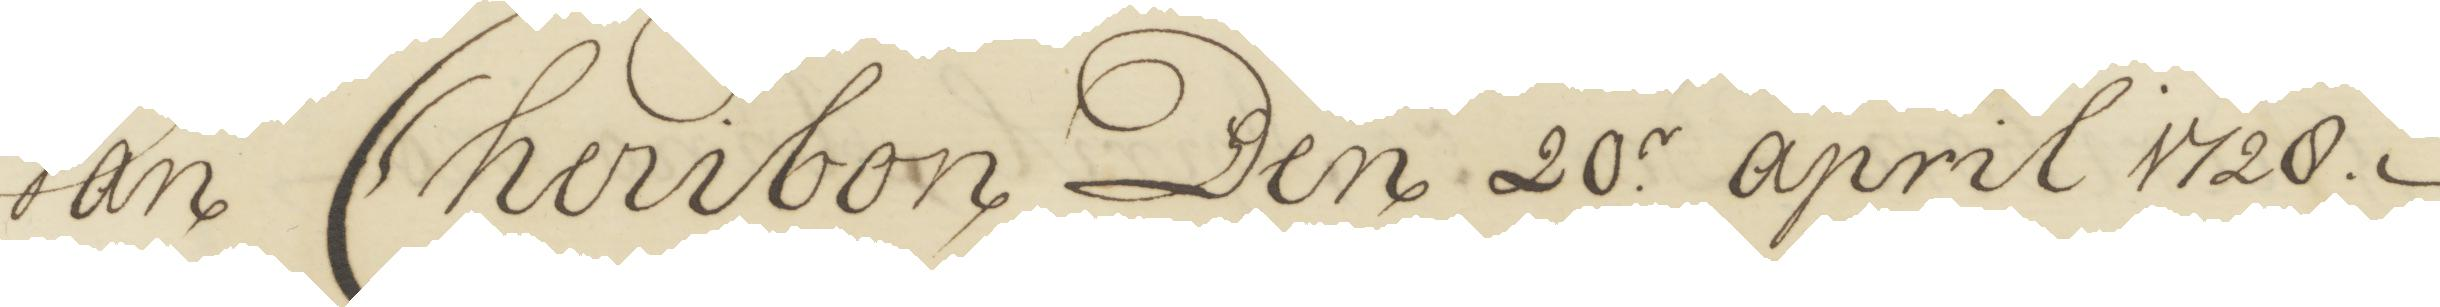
Van Cheribon Den 20:e april 1728. —
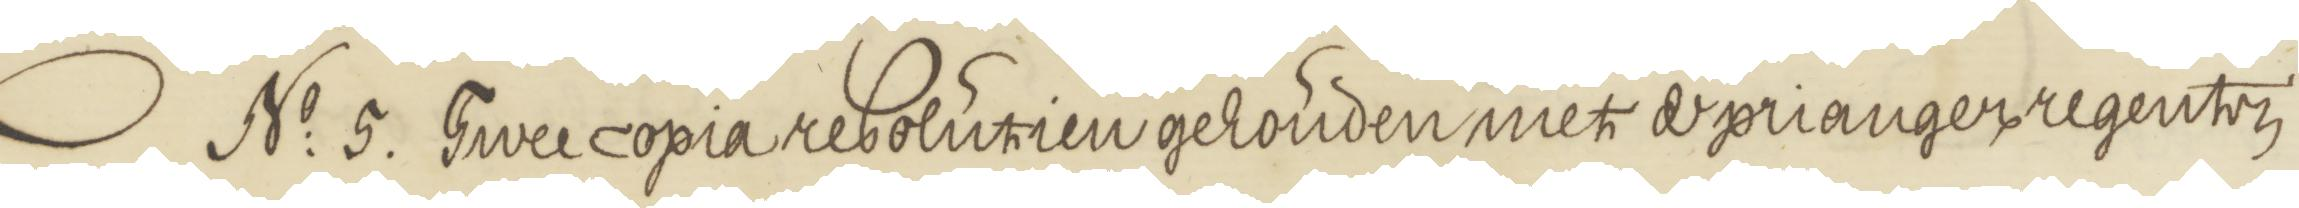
N:o 5. Twee copia resolutien gehouden met de prianger regenten
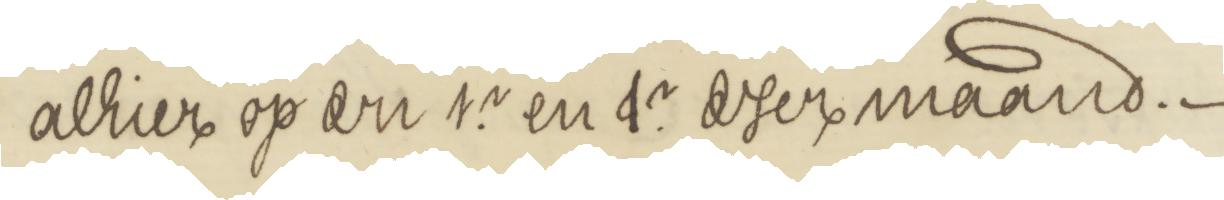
alhier op den 1:e en 4:e deser maand. —
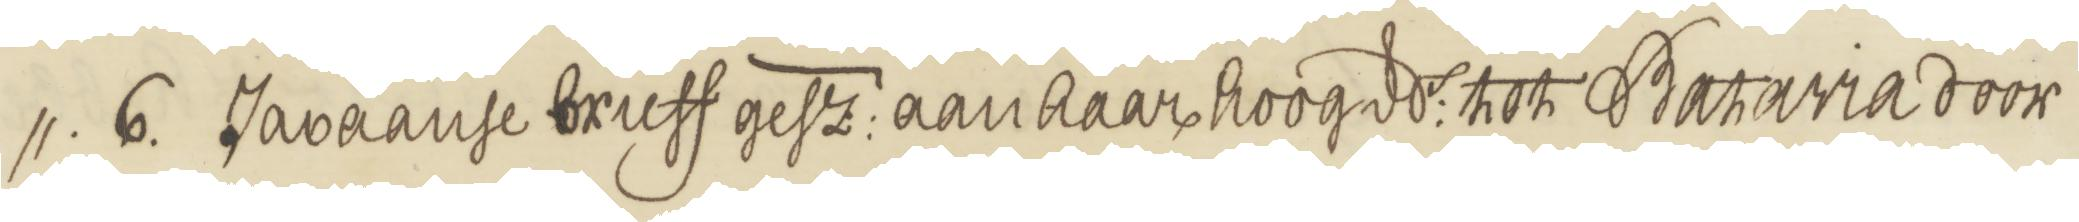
„. 6. Iavaanse brieff gesz: aan haar hoog Ed:s tot Batavia door
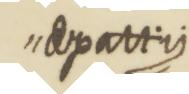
„de pattij
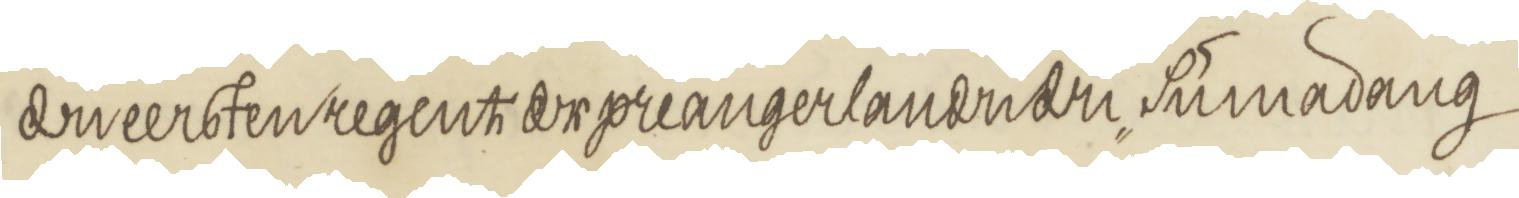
den eersten regent der preangerlanden den „ Sumadang
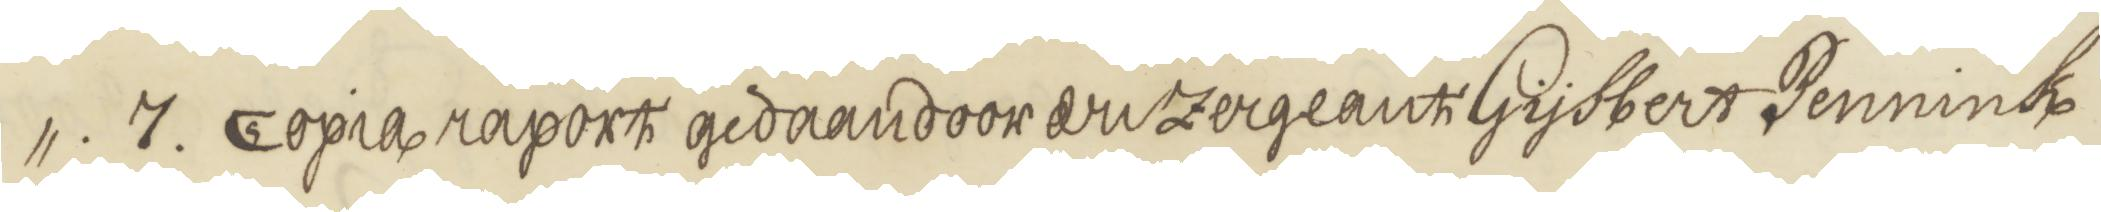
„. 7. Copia raport gedaan door den zergeant Gijsbert Pennink
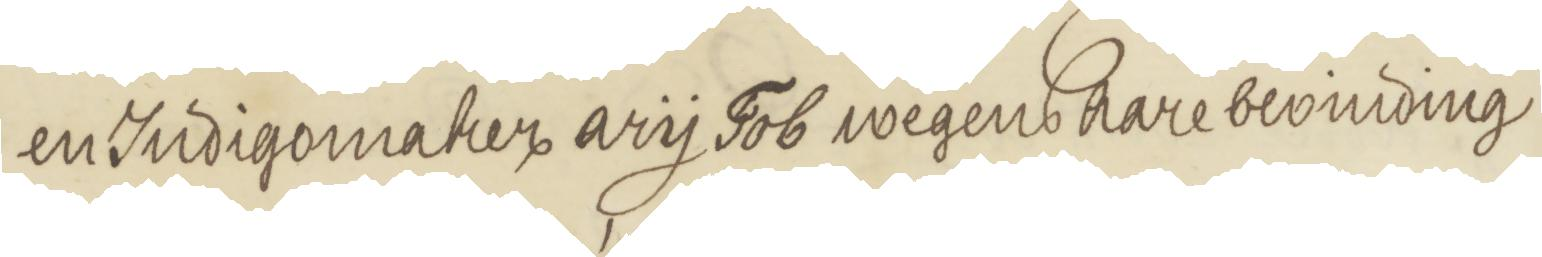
en Indigomaker arij Tob wegens hare bevinding
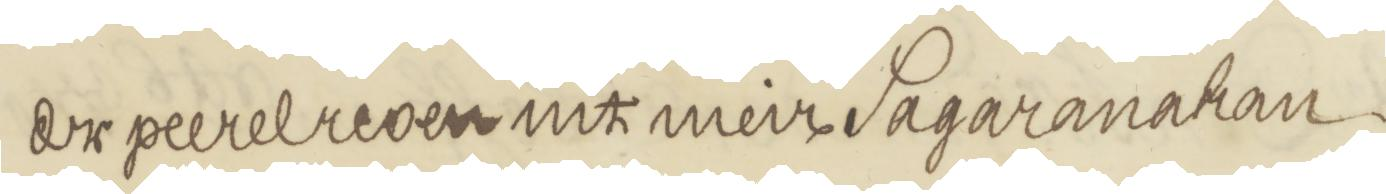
der peerelreven in't meir Sagaranakan
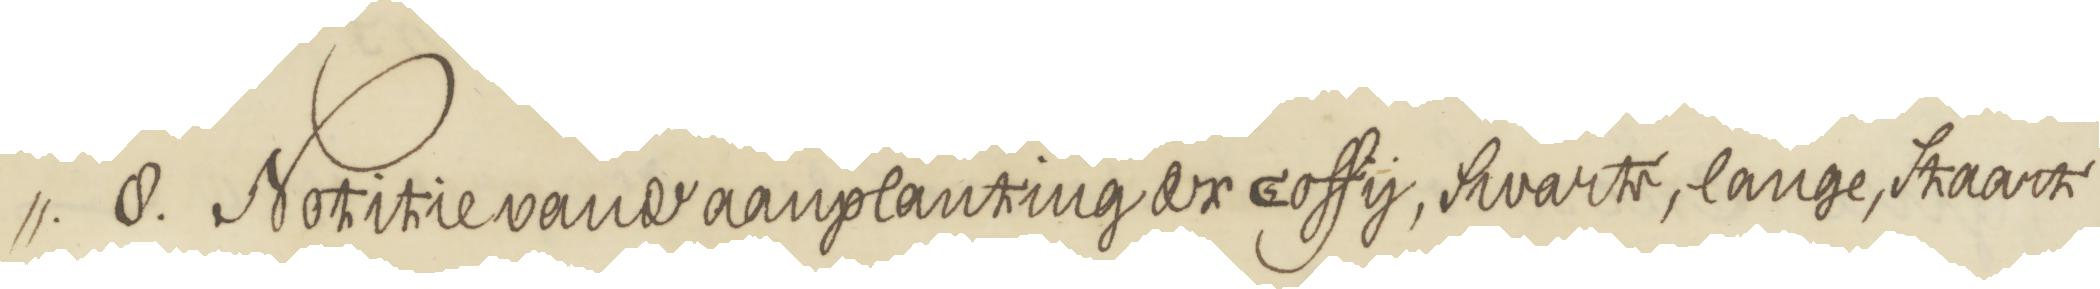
„. 8. Notitie van de aanplanting der coffij, Swarte, lange, Staart
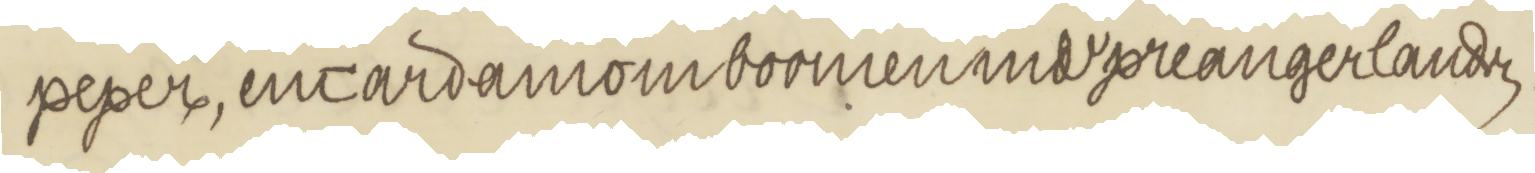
peper, en cardamomboomen inde preangerlanden
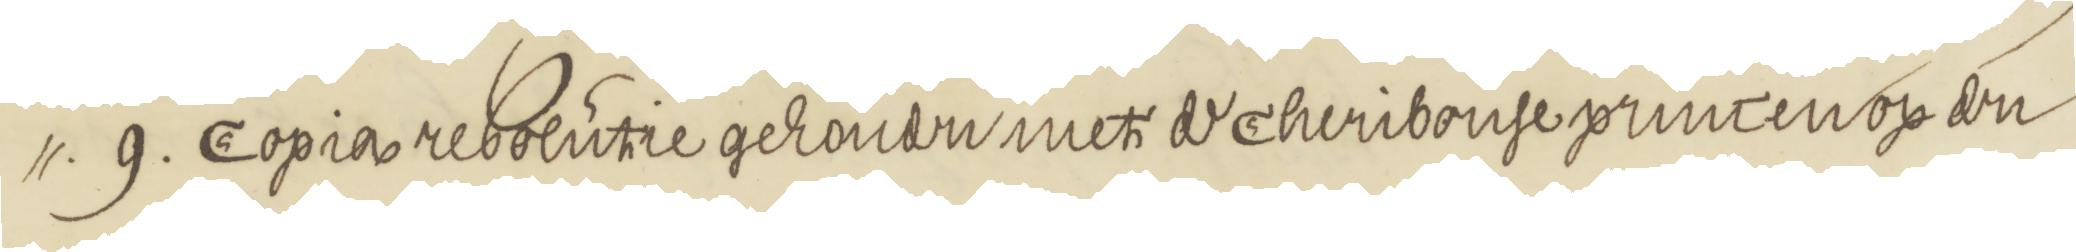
„. 9. Copia resolutie gehouden met de Cheribonse princen op den
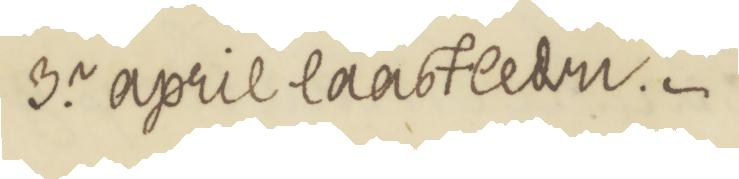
3:e april laastleden. —
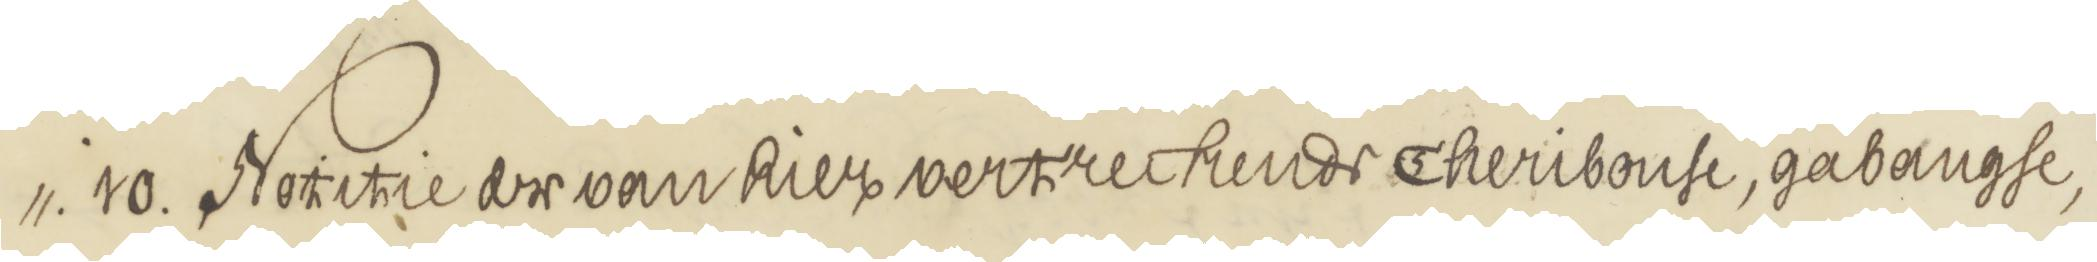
„. 10. Notitie der van hier vertreckende Cheribonse, gabangse,
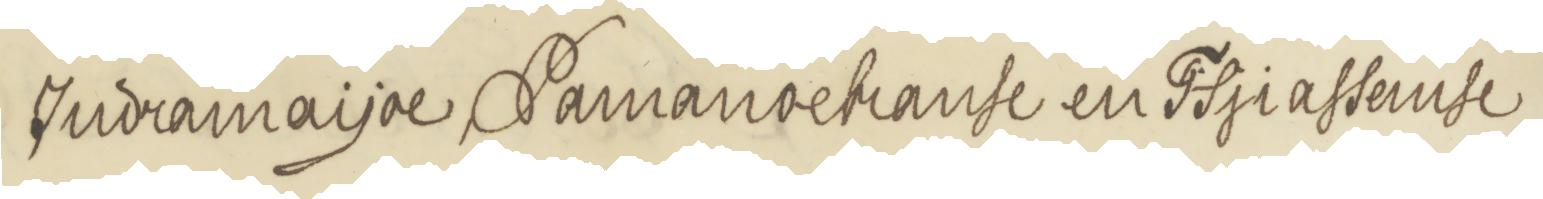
Indramaijoe, Pamanoekanse en Tsjiassemse
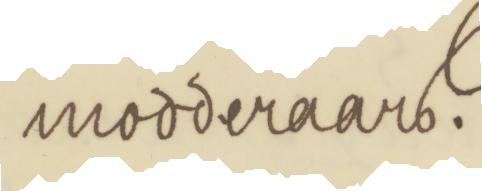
modderaars.
